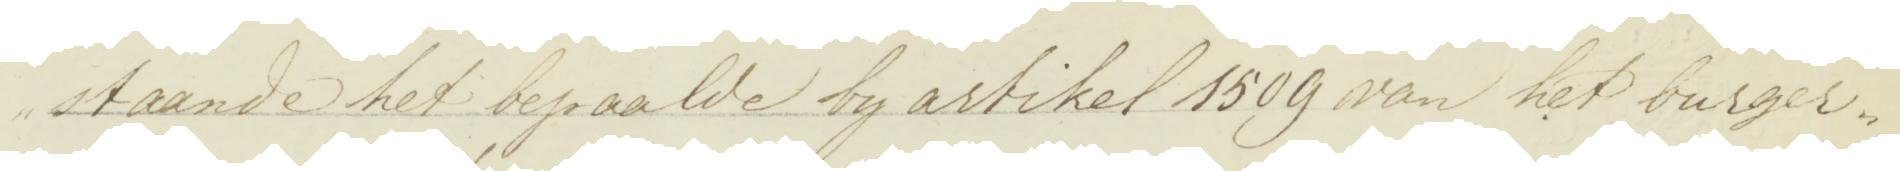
„staande het bepaalde by artikel 1509 van het burger„
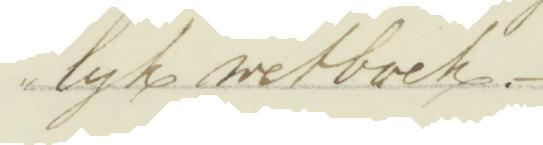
„lyk wetboek. —
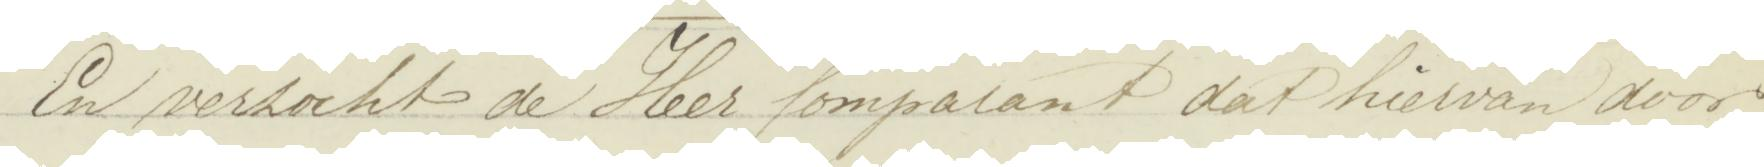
En verzocht de Heer Comparant dat hiervan door
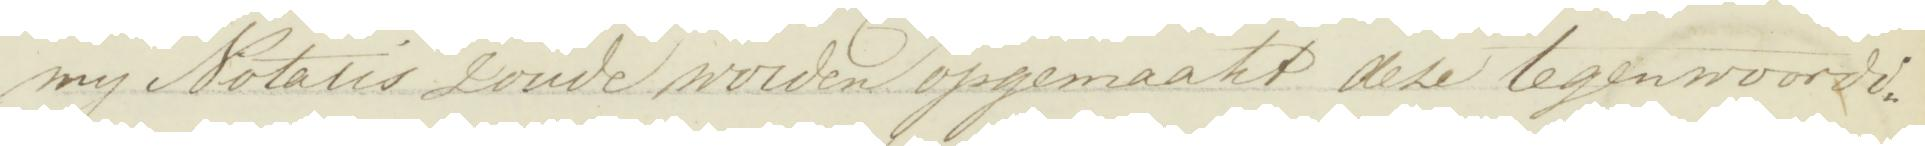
my Notaris zoude worden opgemaakt deze tegenwoordi„
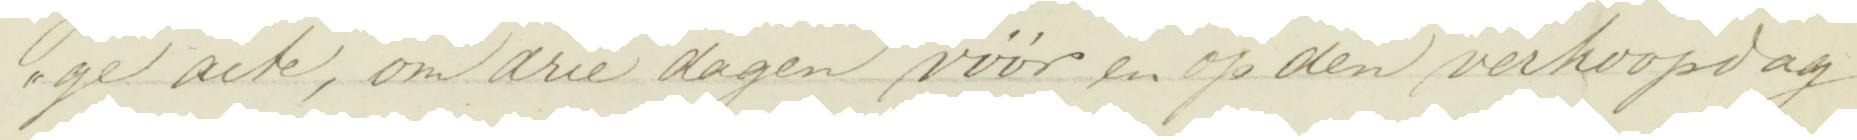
„ge acte, om drie dagen vóór en op den verkoopdag
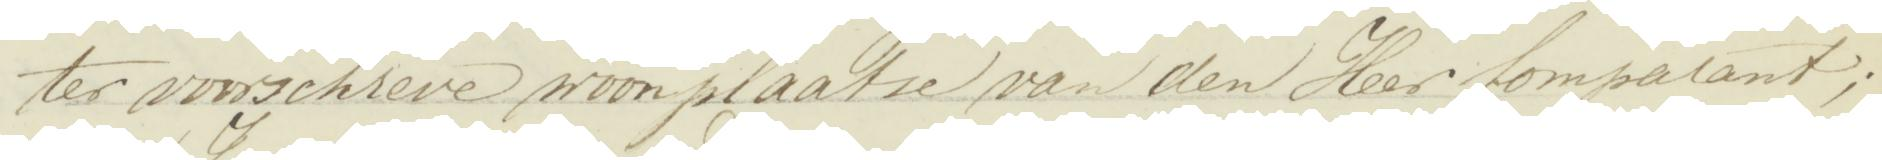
ter voorschreve woonplaatse van den Heer Comparant,
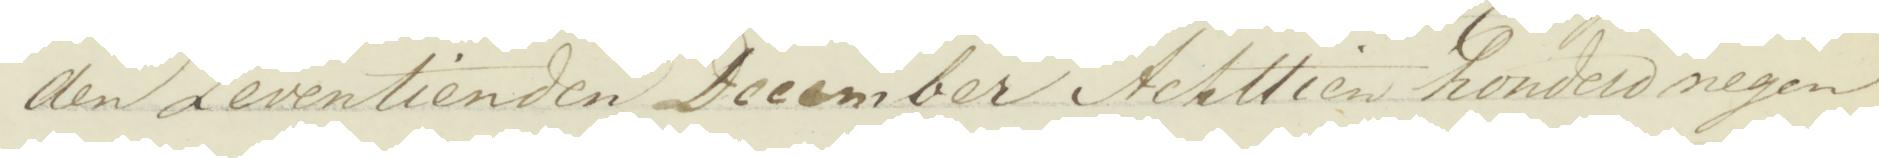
den Zeventienden December Achttien honderd negen
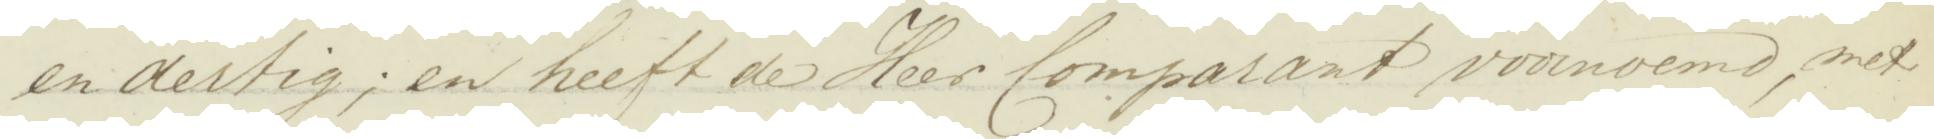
en dertig; en heeft de Heer Comparant voornoemd, met
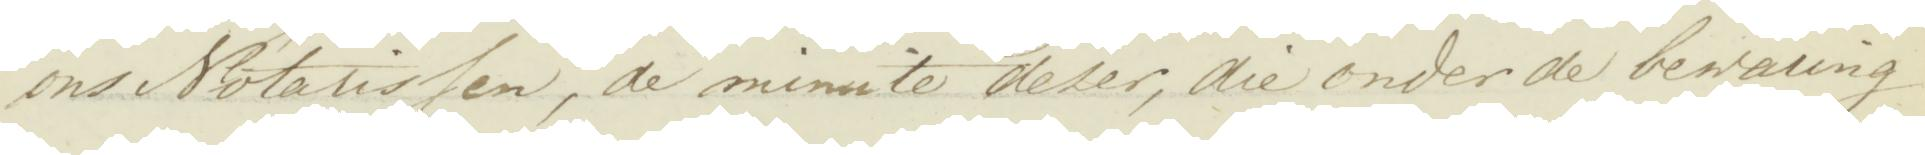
ons Notarissen, de minute dezer, die onder de bewaring
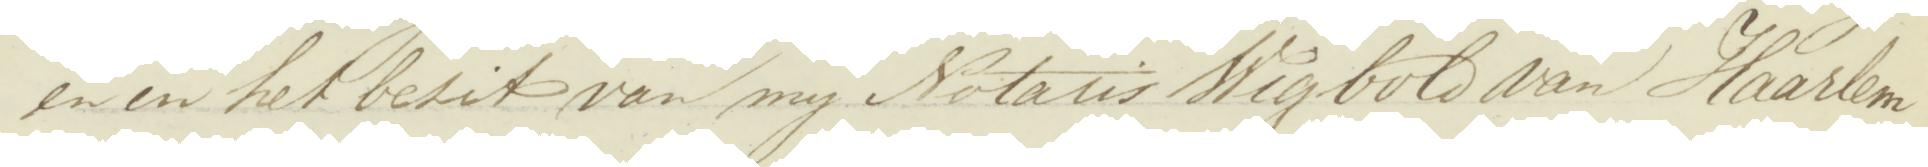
en in het bezit van my Notaris Wigbold van Haarlem
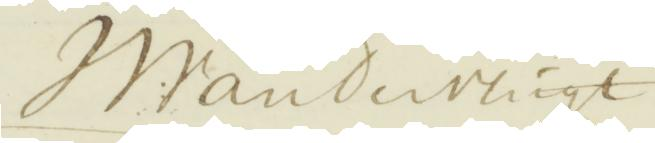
W: van der vlugt
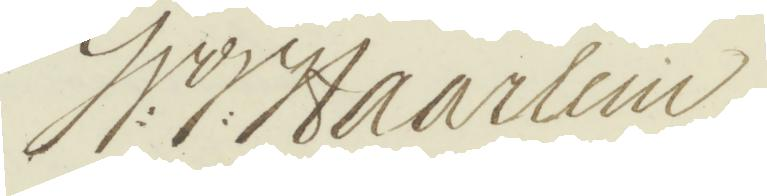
W: V: Haarlem.
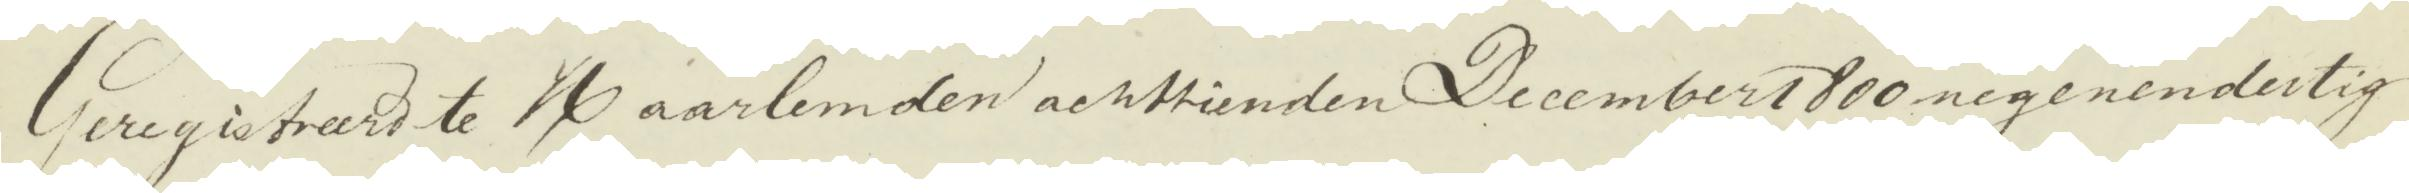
Geregistreerd te Haarlem den achttienden December 1800 negenendertig
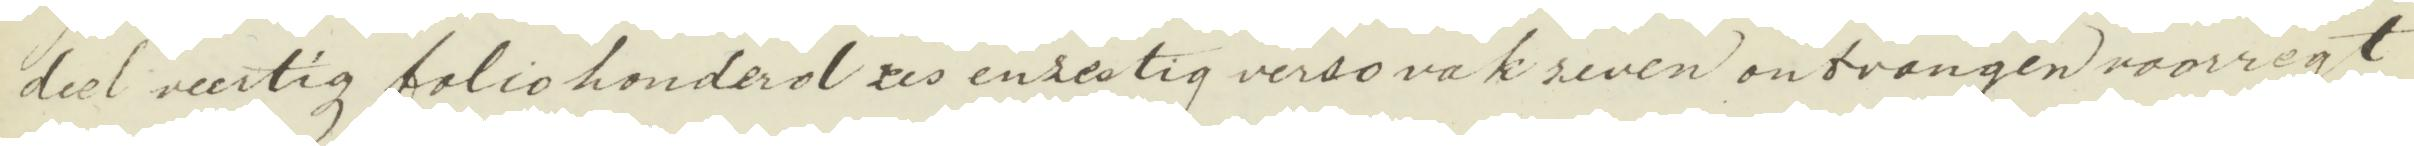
deel veertig folio honderd zes en zestig verso vak zeven ontvangen voorregt
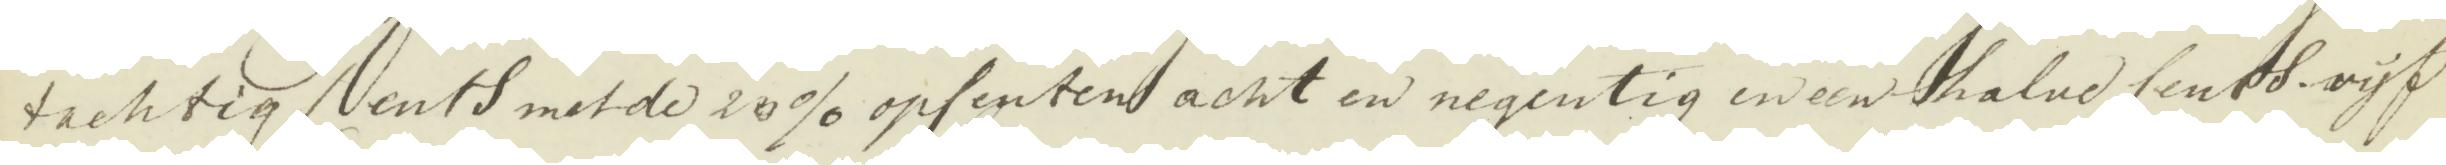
tachtig Cents met de 20% opCenten acht en negentig en een halve Cents. vijf
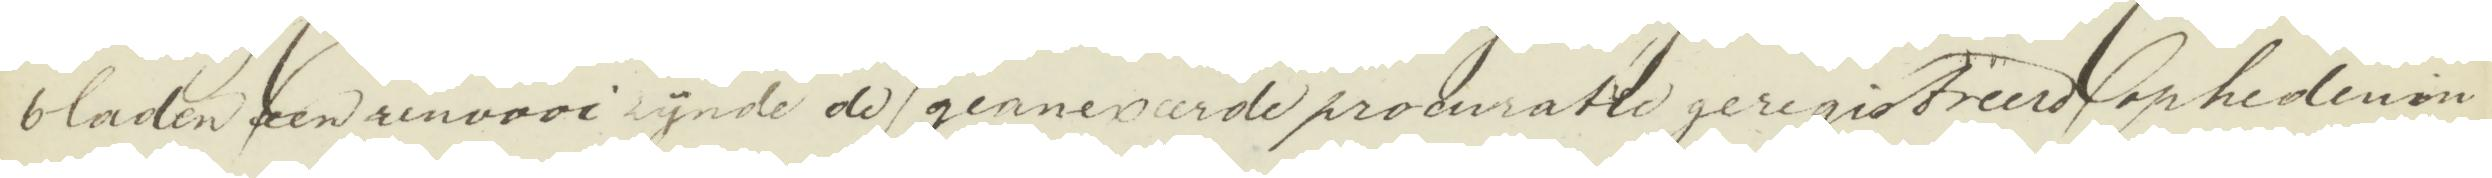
bladen een renvooi zijnde de geanexeerde procuratie geregistreerd op heden in
